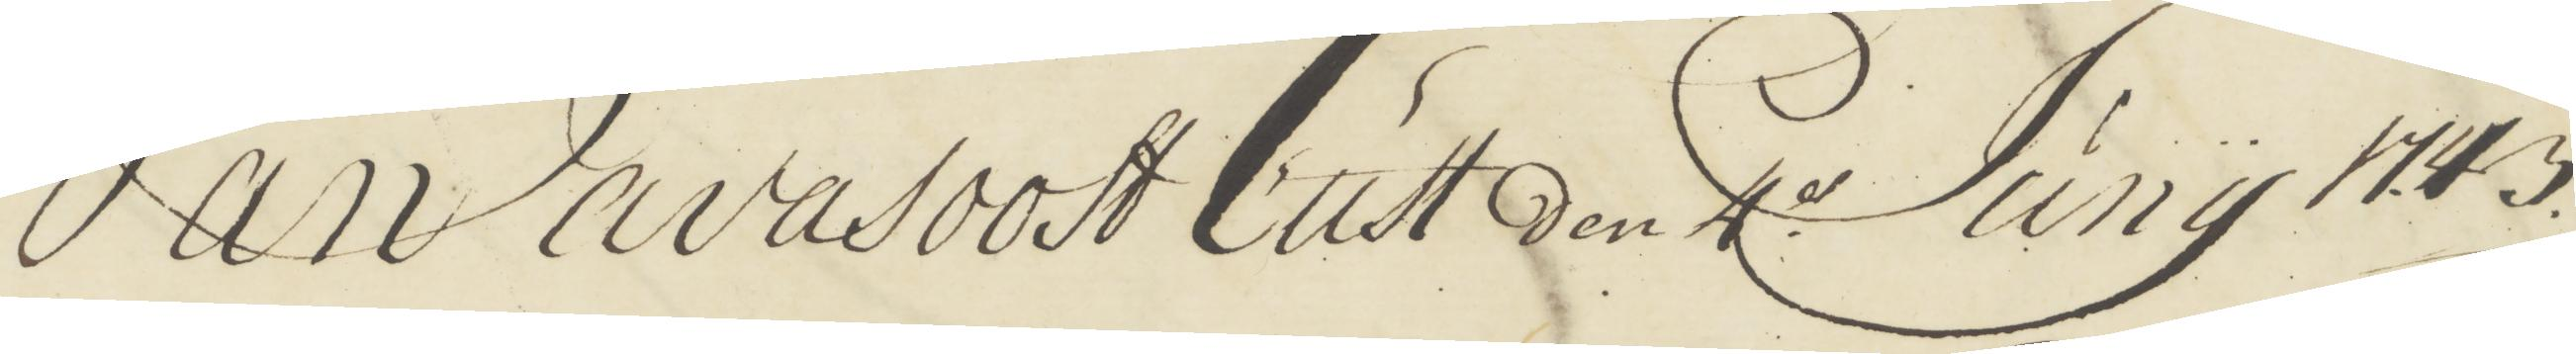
Van Iavasoost Cust den 4:e Iunij 1743.
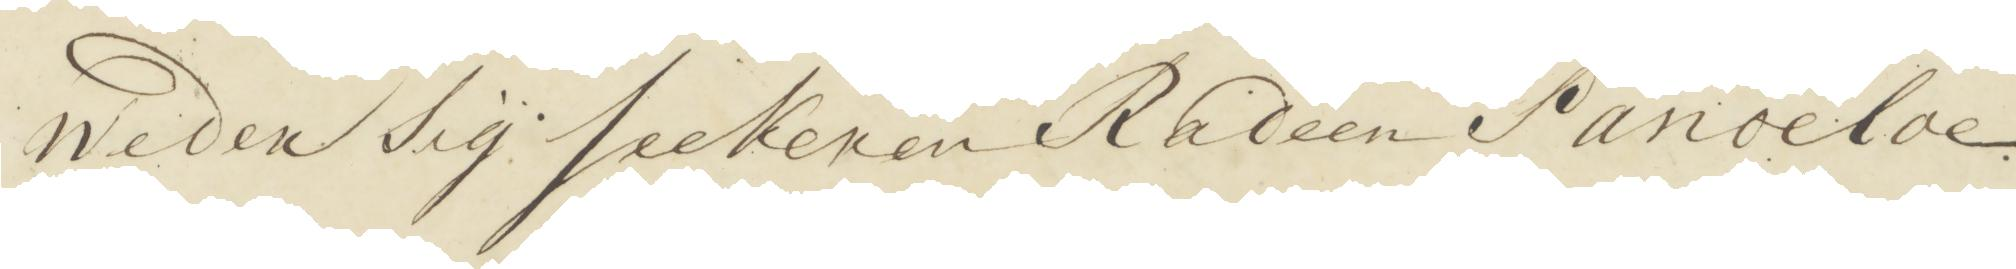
weder sig seekeren Radeen Panoeloe
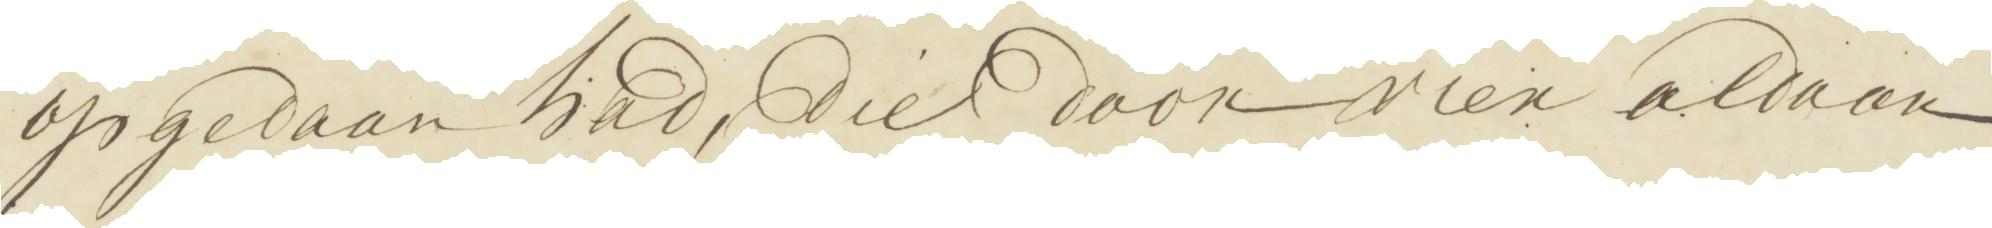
opgedaan had, die door vier aldaar
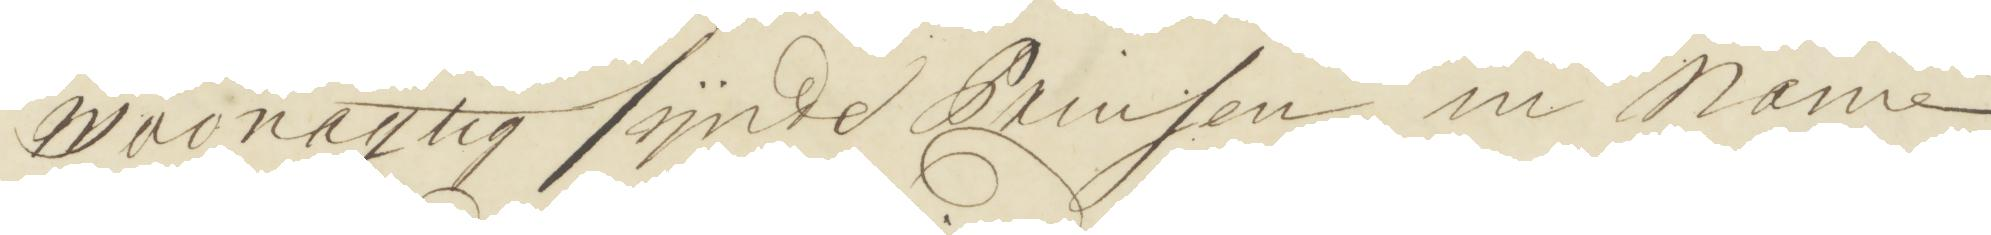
woonagtig sijnde Prinsen in Name
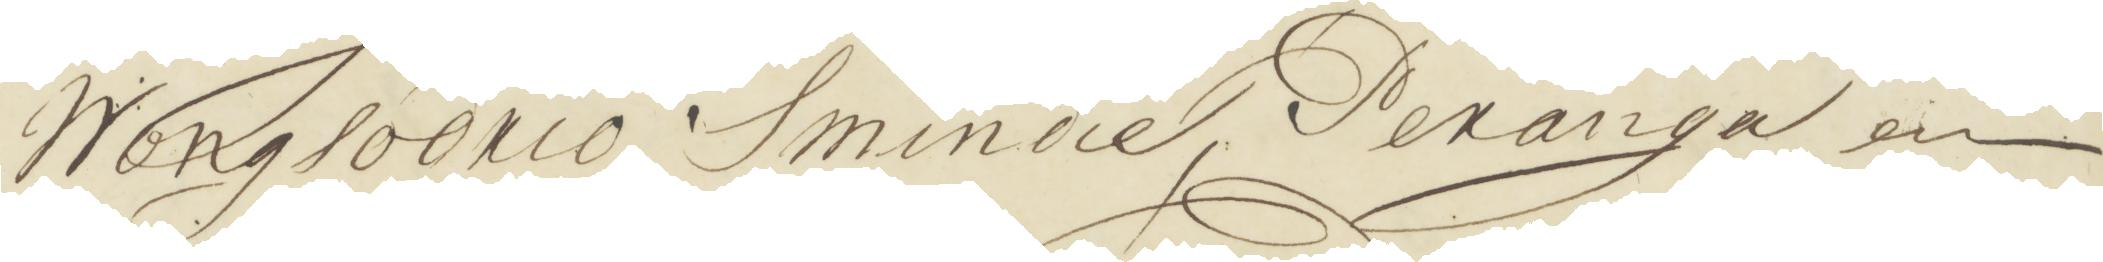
Wongsodrio, smindie, Peranga en
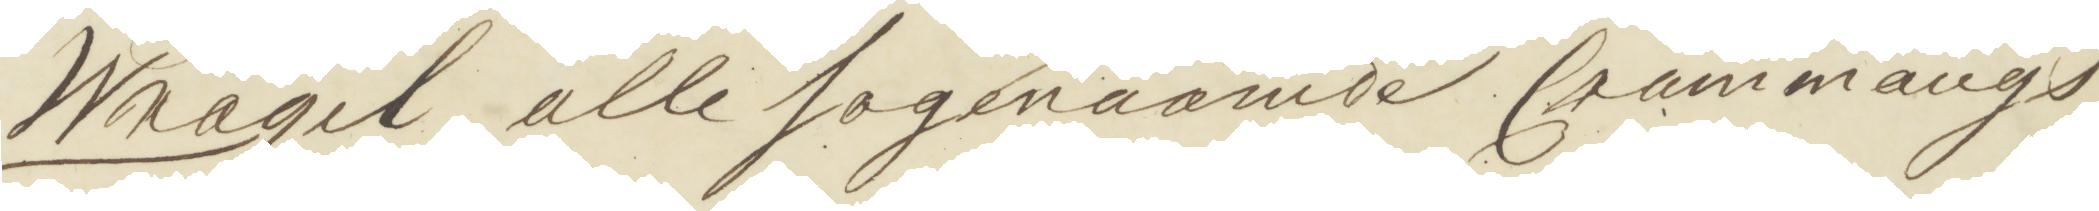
Wragil, alle sogenaamde Crammangs,
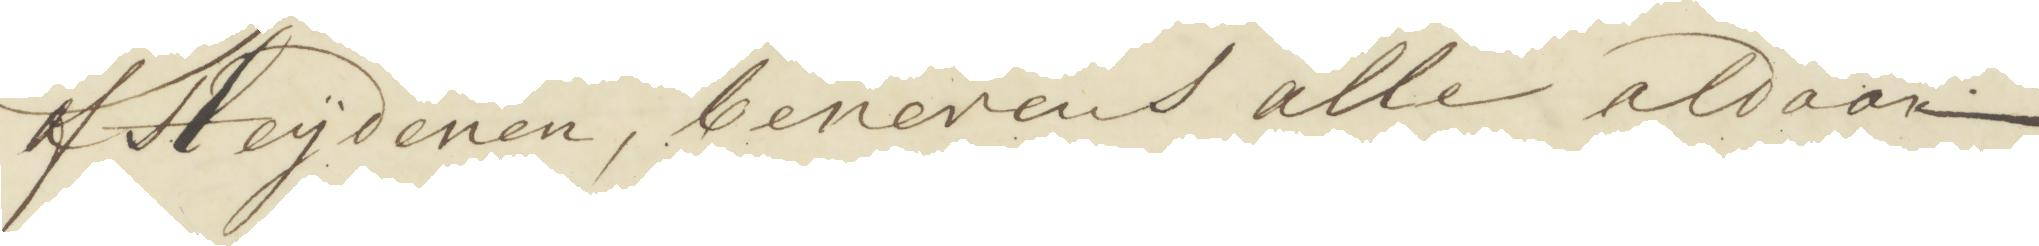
of Heijdenen, benevens alle aldaar
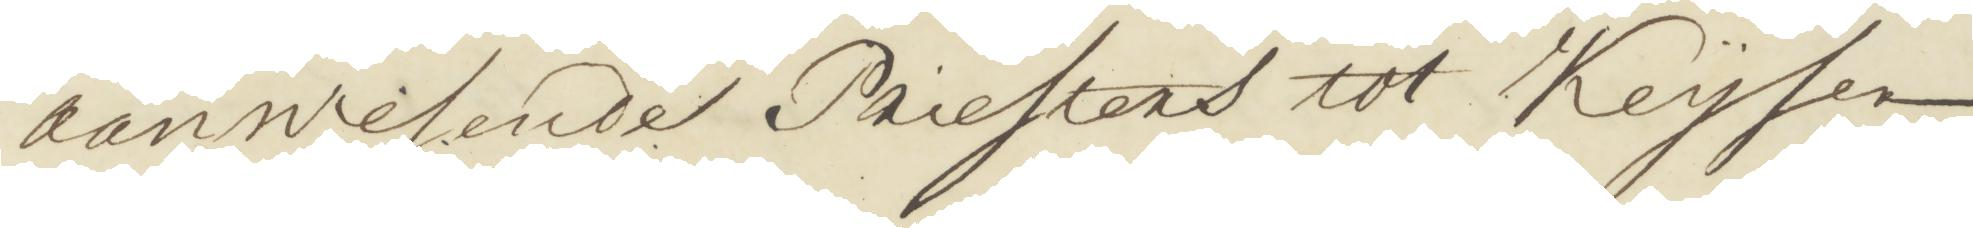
aanwesende Priesters tot Keijser
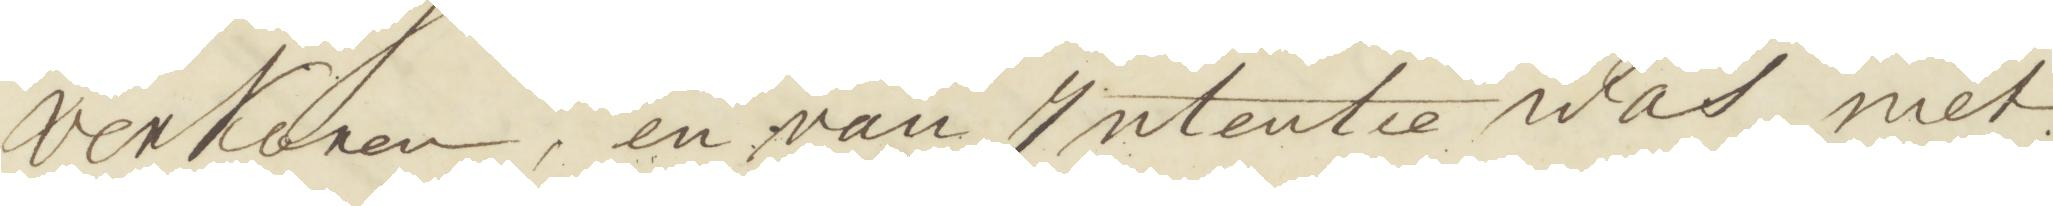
verkoren, en van Jntentie was met
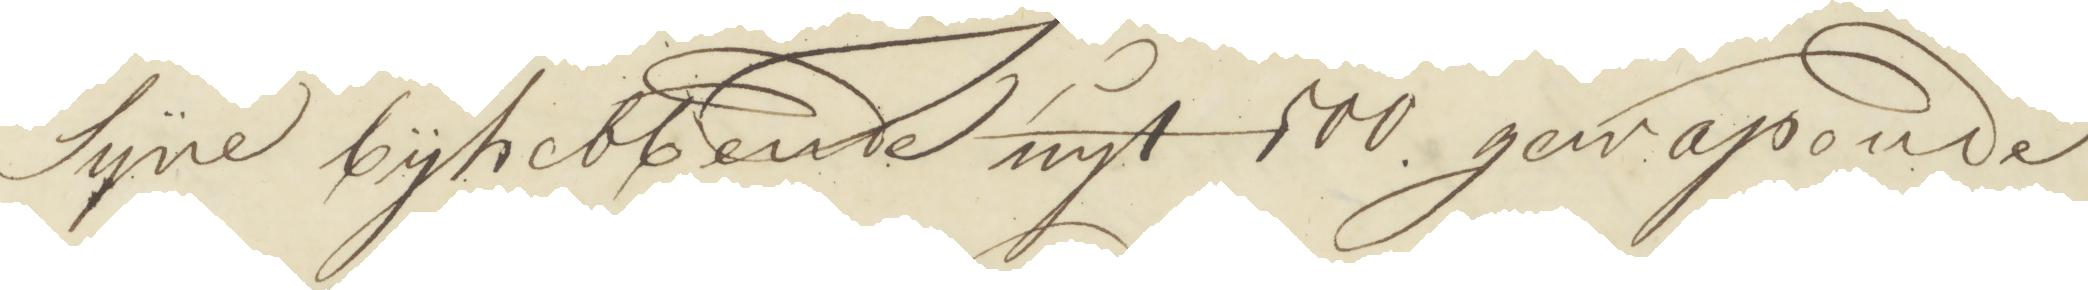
sijne bijhebbende uijt 500. gewapende
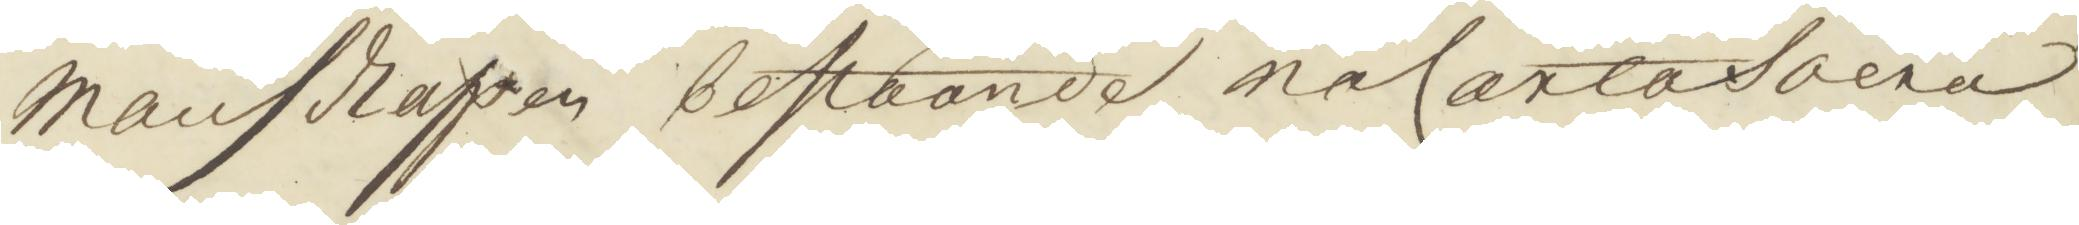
manschappen bestaande na Cartasoera
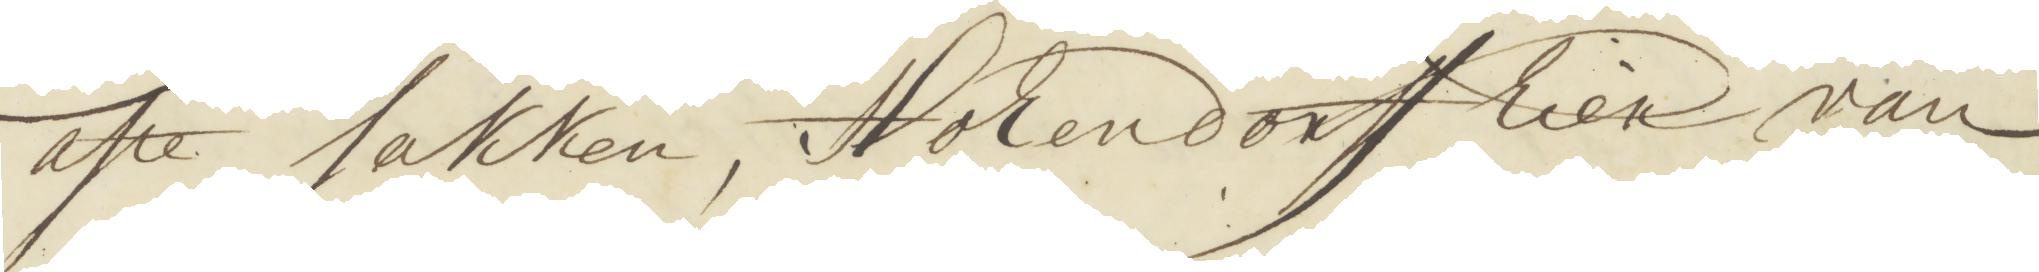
afte sakken, Hohendorff hier van
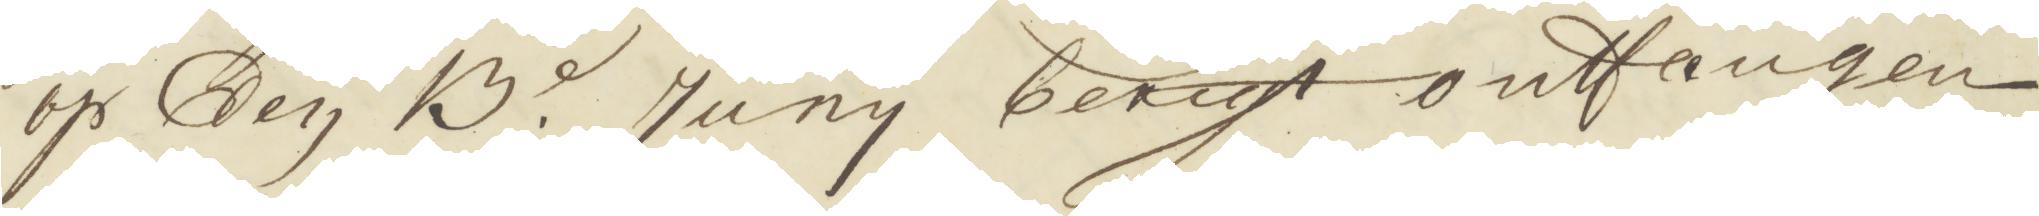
op den 13.e Junij berigt ontfangen
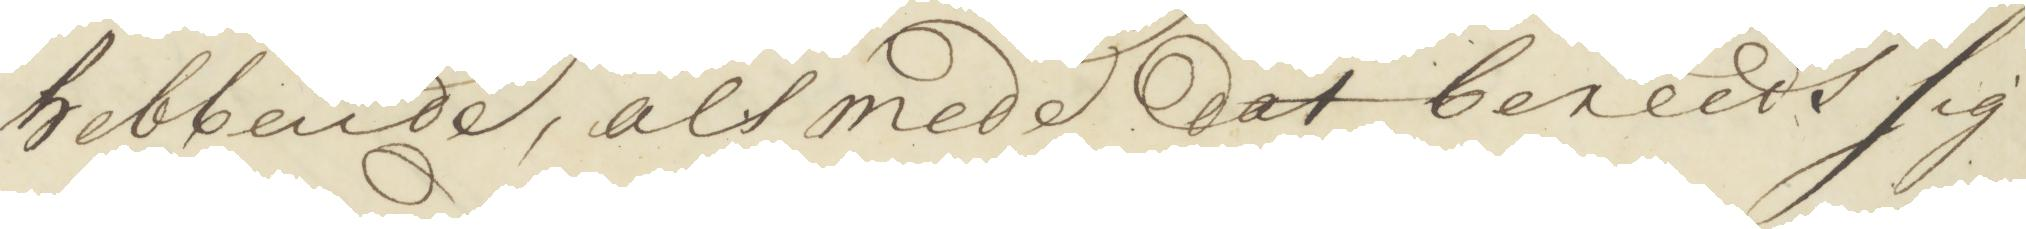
hebbende, als mede dat bereeds sig
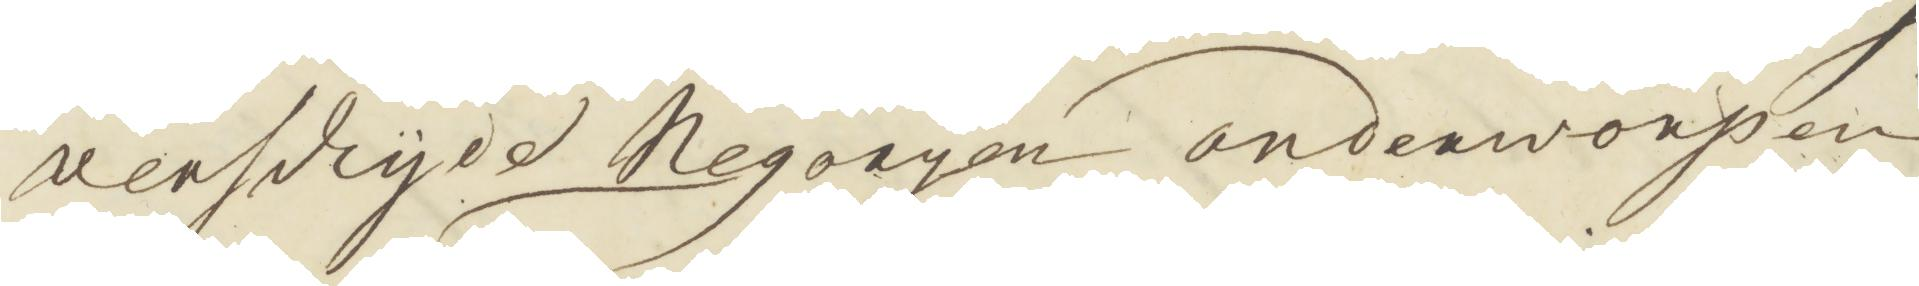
verschijde Negorijen onderworpen
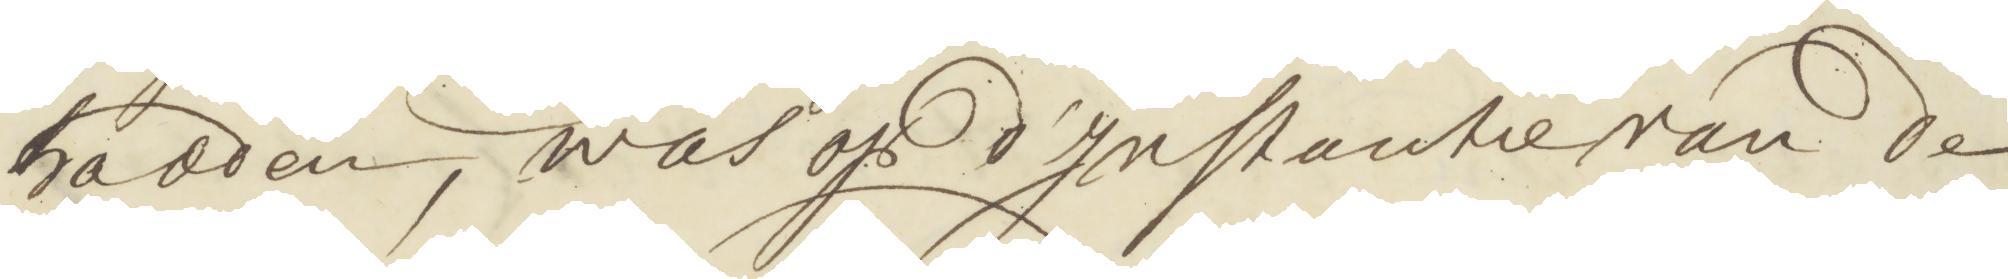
hadden, was op d’ Jnstantie van de
